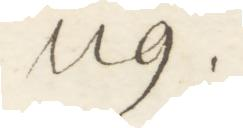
119.
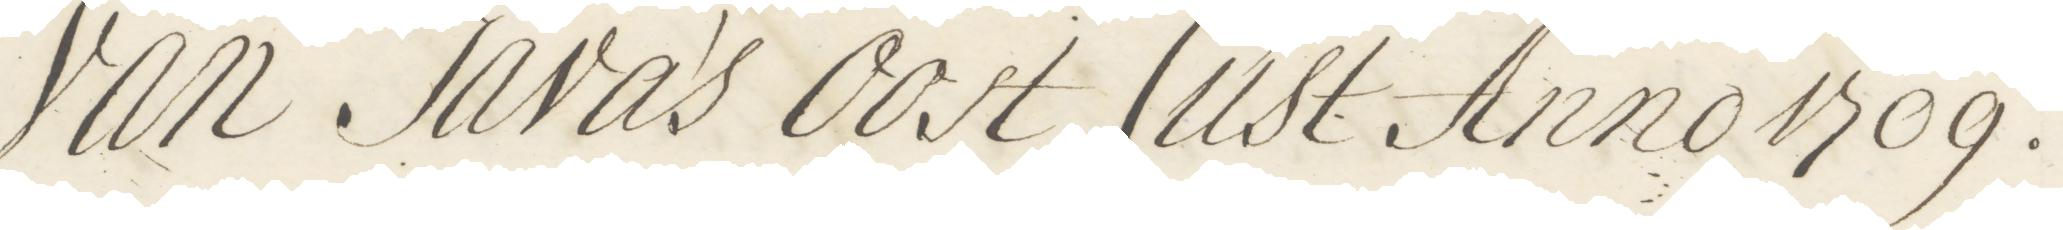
Van Iava's Oost Cust Anno 1709.
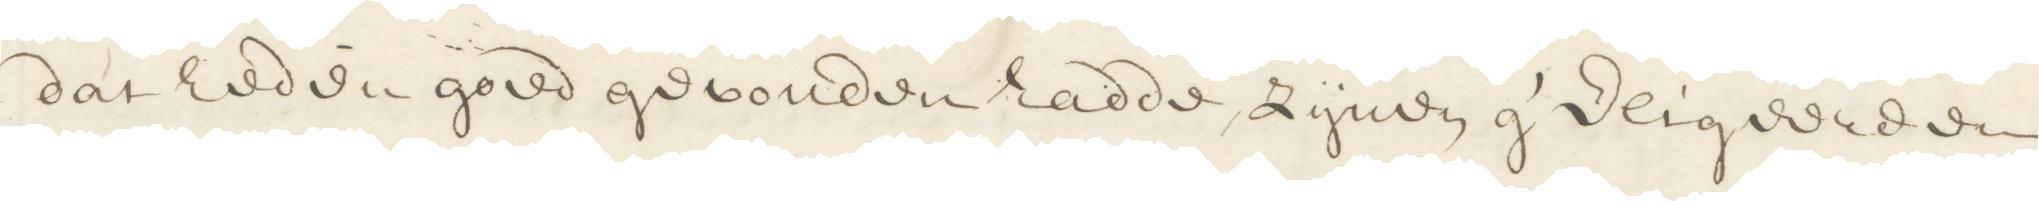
dat heden goed gevonden hadde, zijnen g’Eligeerden
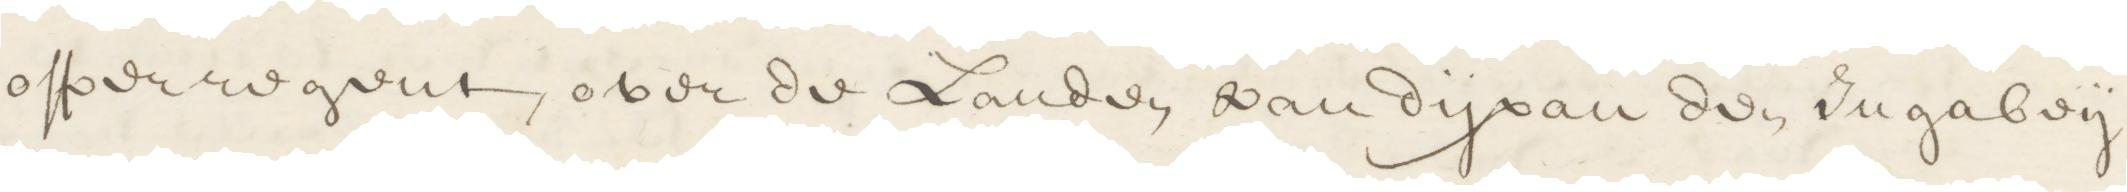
opperregent, over de landen van dijpan den Ingabeij
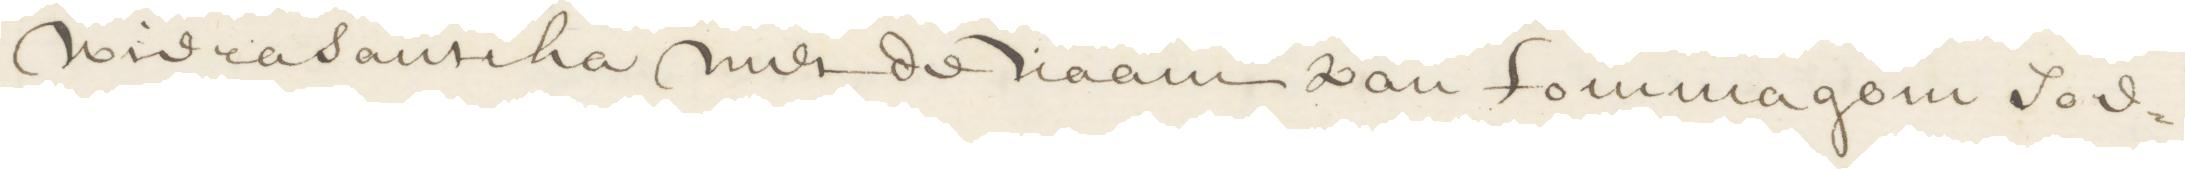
wierasantika met de naam van tommagom soe=
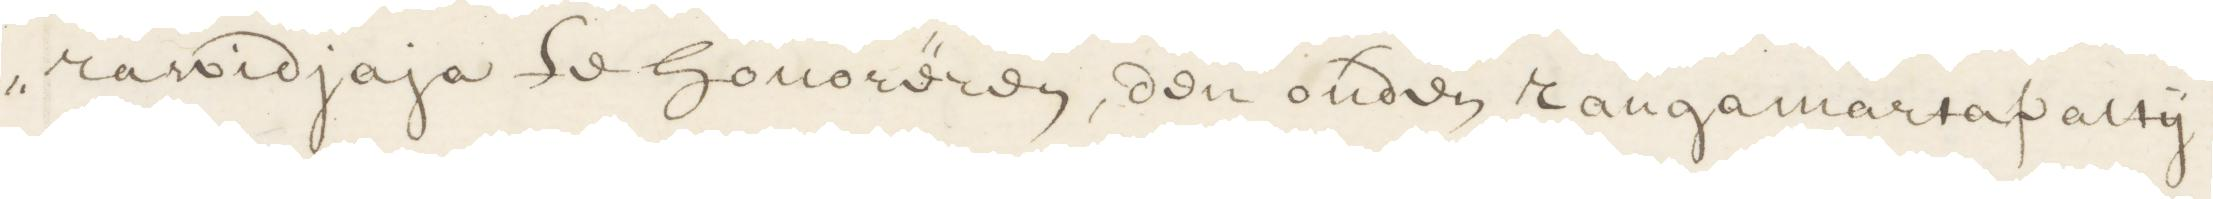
„ rawidjaja te honorëren, den ouden rangamartapattij
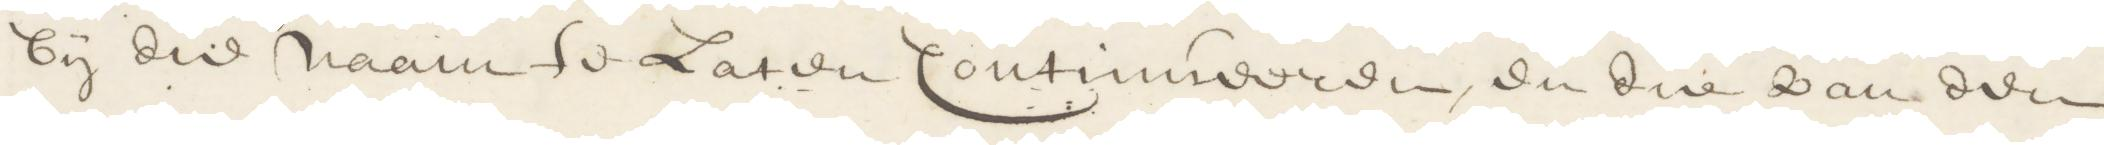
bij die naam te laten Continueeren, en die van den
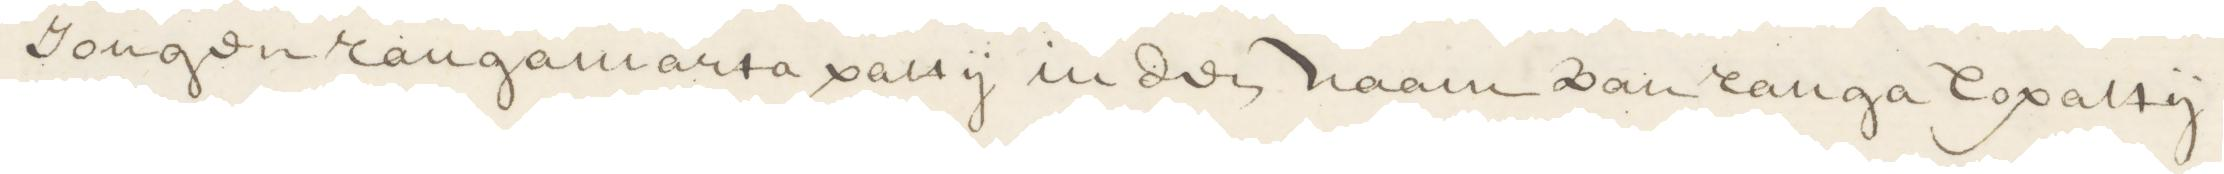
Iongen rangamarta pattij in den naam van ranga copattij
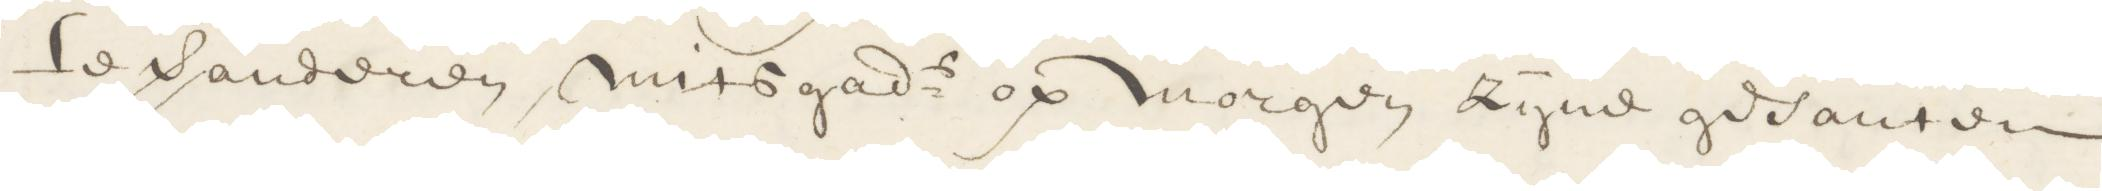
te veranderen, mitsgad=s op morgen zijne gesanten
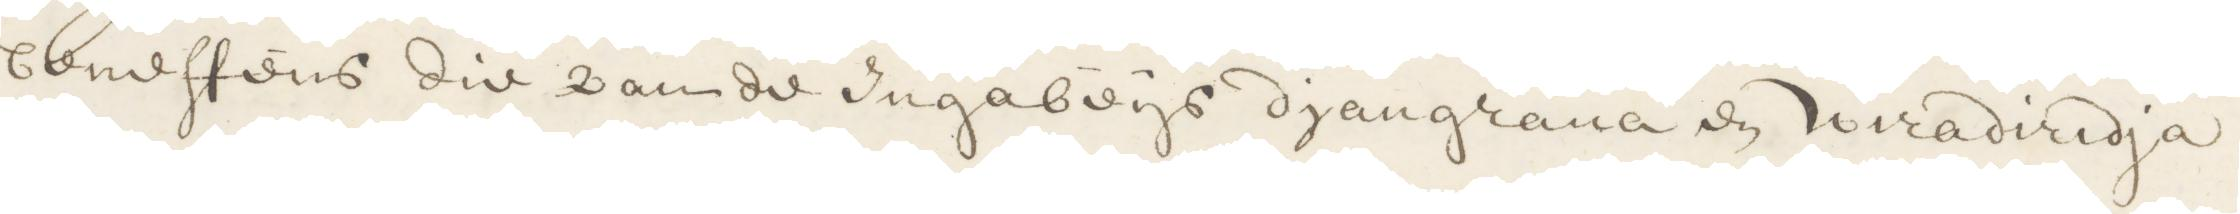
beneffens die van de Ingabeijs djangrana en wiradiridja
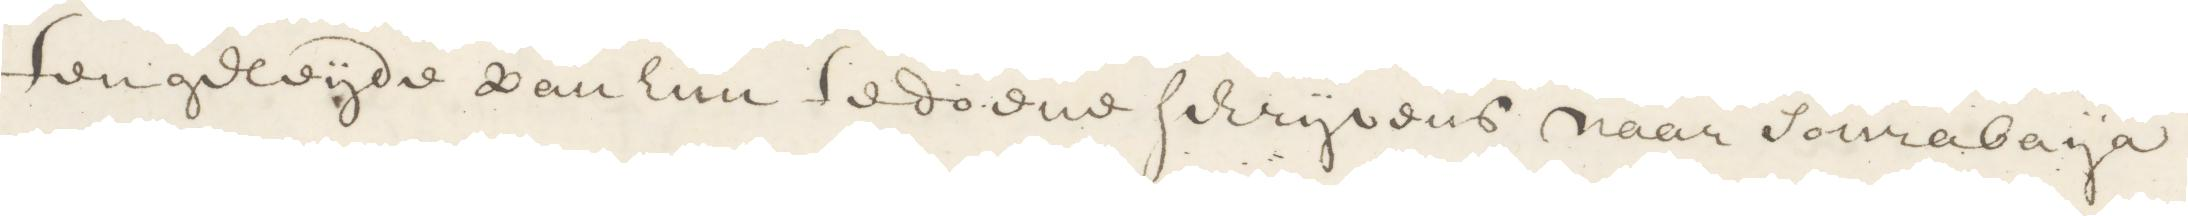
ten geleijde van hun te doene schrijvens naar sourabaija
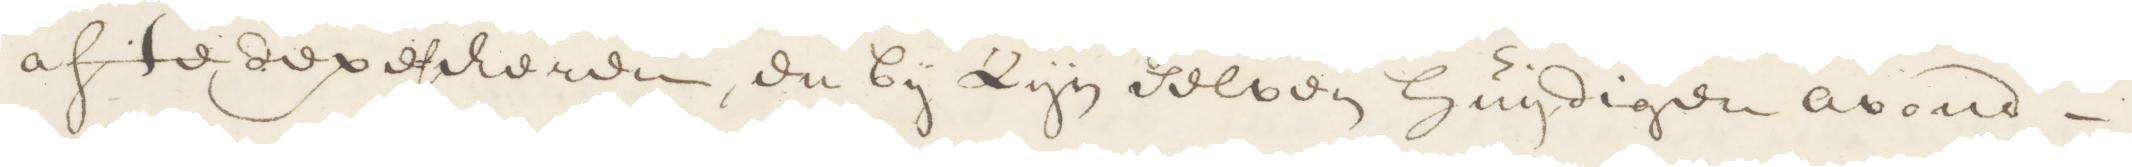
af te depescheren, en bij zijn selven huijdigen avond —
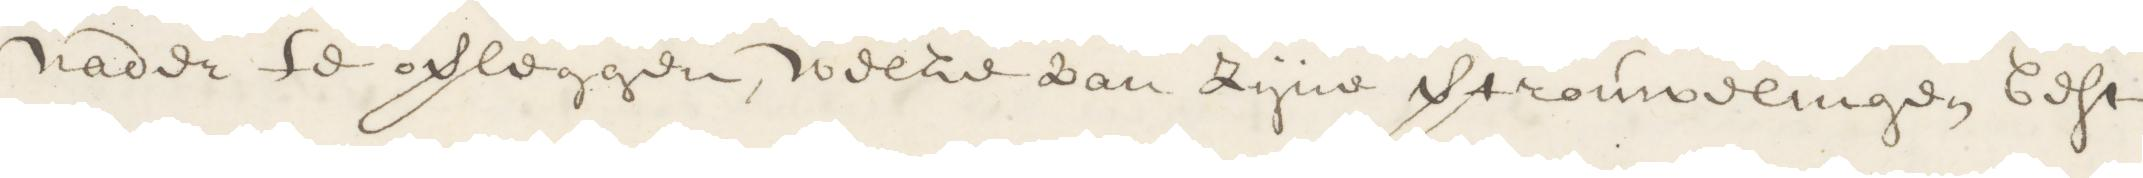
nader te overleggen, welke van zijne vertrouwelingen best
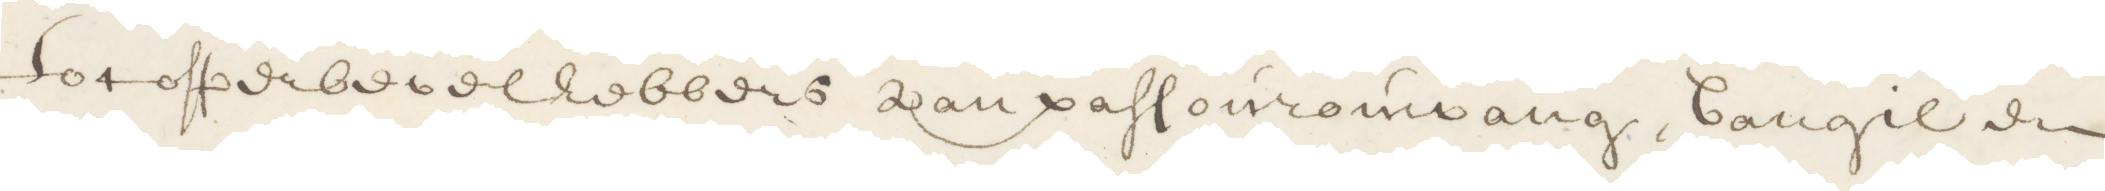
tot opperbevelhebbers van passourouwang, bangil en
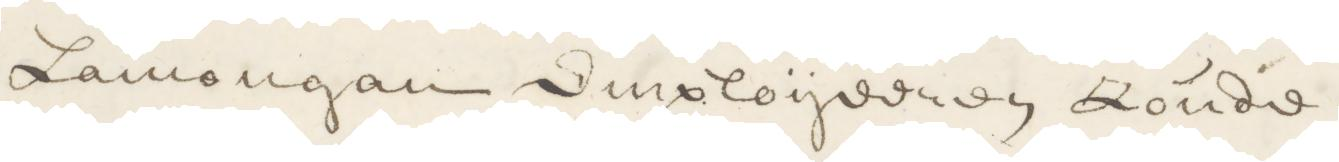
lamongan Emploijeeren zoude
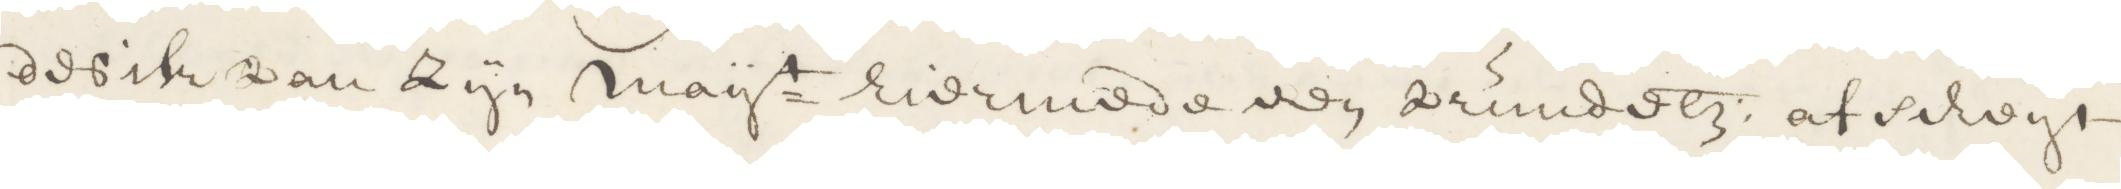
desik van zijn maij=t hiermede een vrundelijk afscheijt
